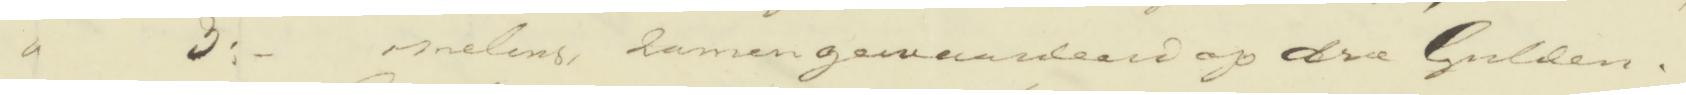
3: — „meling, zamen gewaardeerd op drie Gulden.
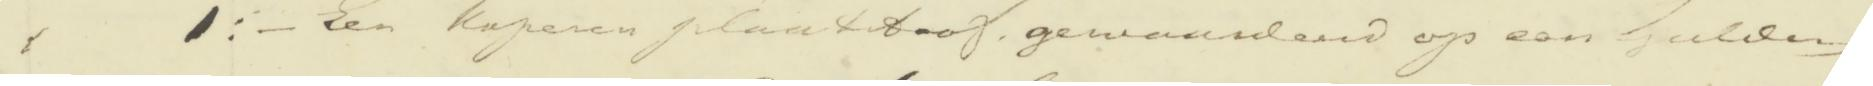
„ 1: — Een koperen plaatstoof, gewaardeerd op een Gulden
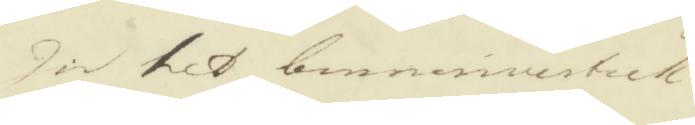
In het binnenvertrek
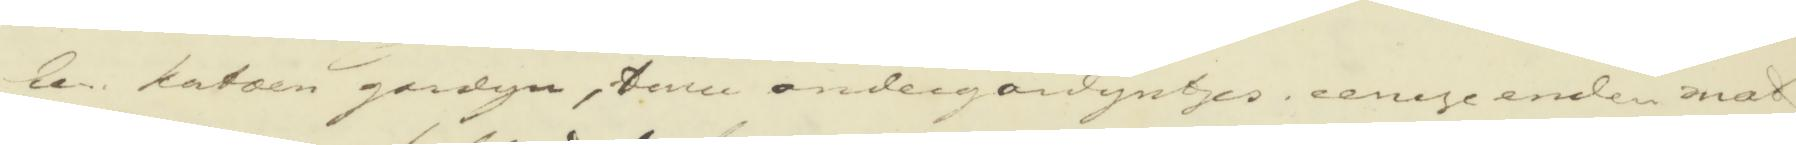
Een katoen gordyn, twee ondergordyntjes, eenige enden mat
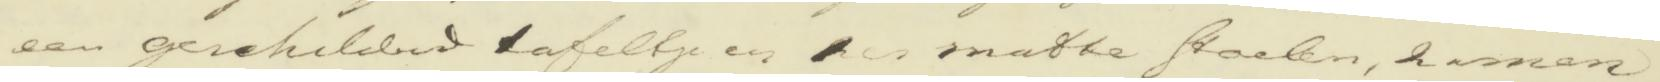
een geschilderd tafeltje en zes matte stoelen, zamen
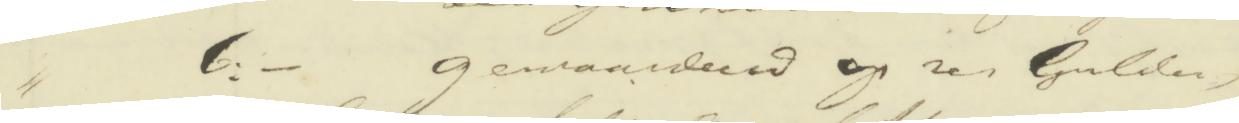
„ 6:— gewaardeerd op zes Gulden
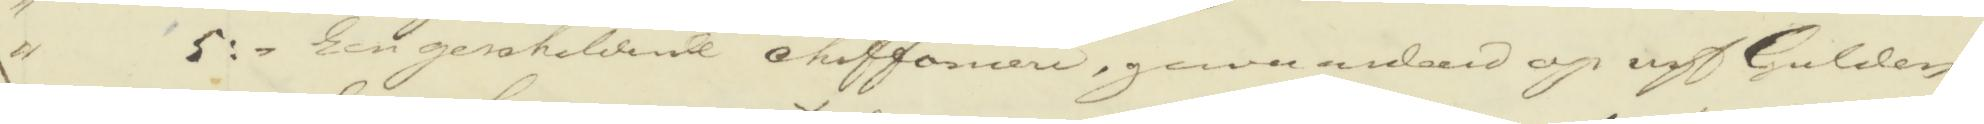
„ 5: — Een geschilderde chiffoniere, gewaardeerd op vyf Gulden
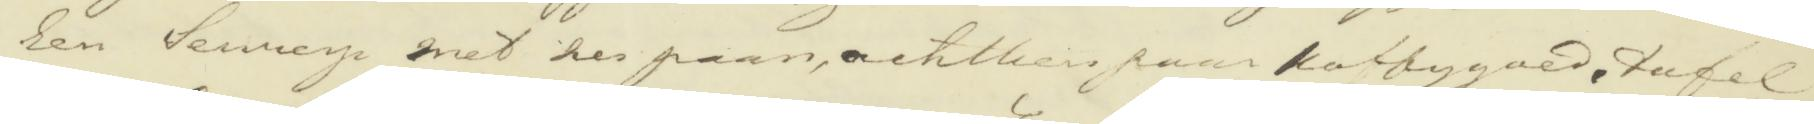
Een Serviesje met zes paar, achttien paar koffygoed, tafel
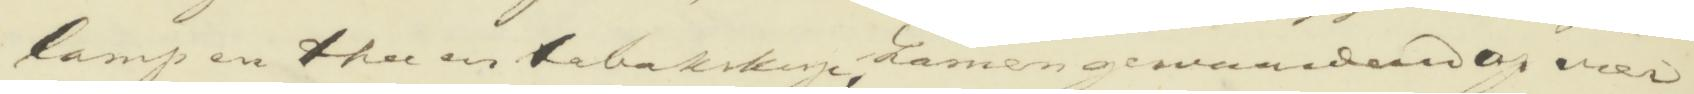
lamp en thee en tabakskisje, Zamen gewaarderd op vier
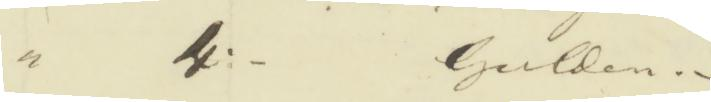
„ 4: — Gulden.
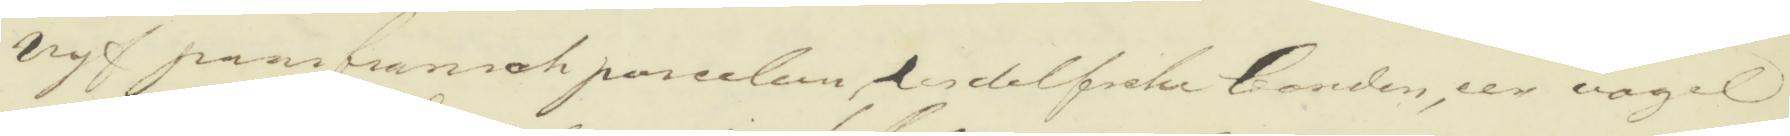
vyf paar fransch porcelein, Zes delfsche borden, een vogel
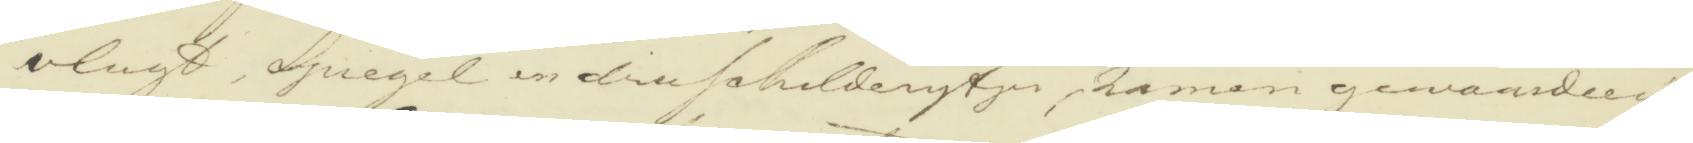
vlugt, Spiegel en drie Schilderytjes, zamen gewaardeerd
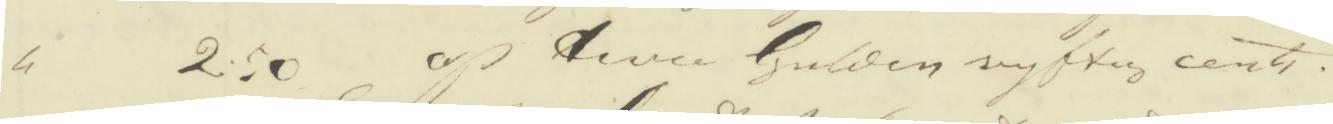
„ 2:50 op twee Gulden vyftig cents.
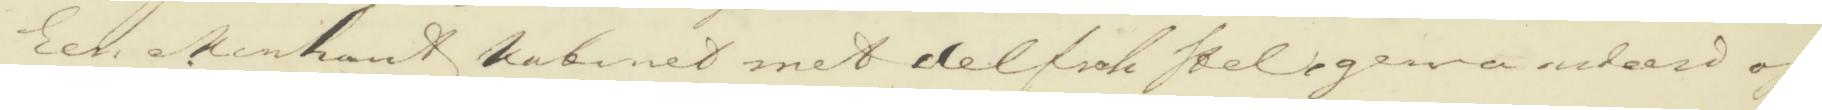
Een ekenhouten kabinet met delfsch stel, gewaardeerd op
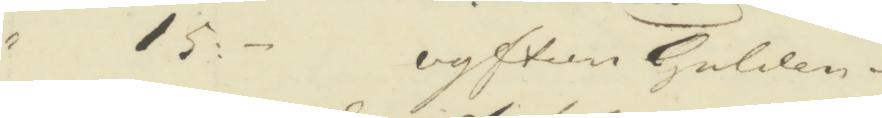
„ 15„— vyftien Gulden.
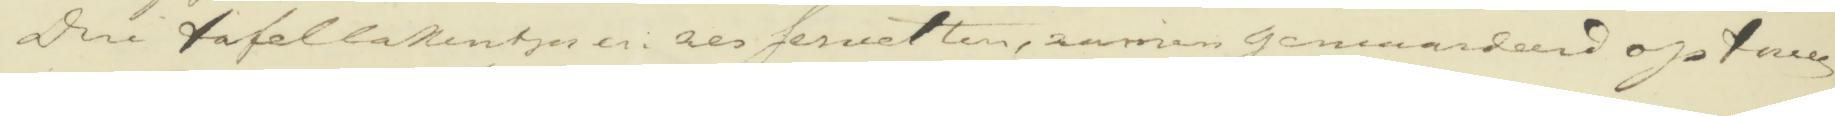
Drie tafellakentjes en zes Servietten, zamen gewaardeerd op twee
